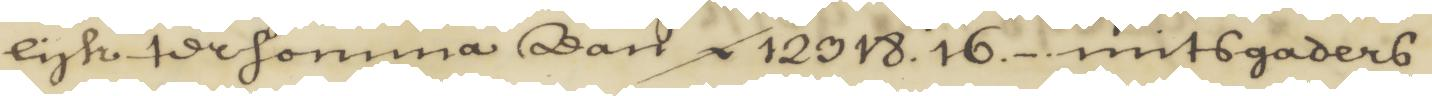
lijk ter somma van ƒ12318.16.- mitsgaders
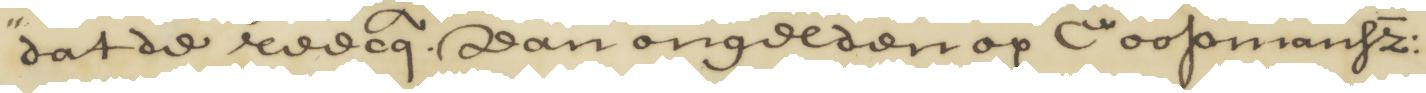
" dat de reecq. van ongelden op Coopmansz:
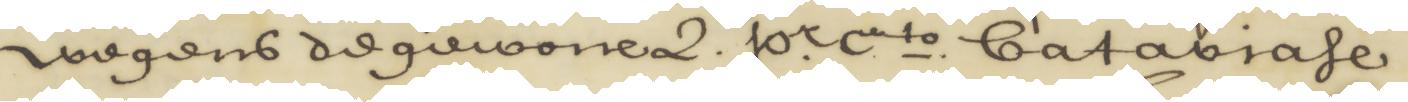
wegens de gewone 2. P.r c-to. bataviase
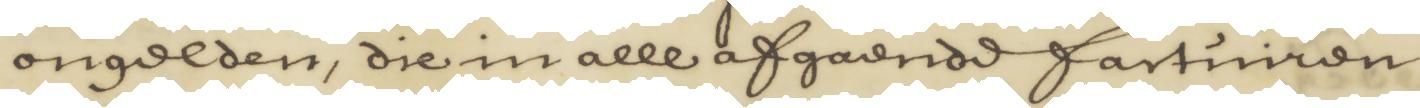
ongelden, die in alle afgaende factuiren
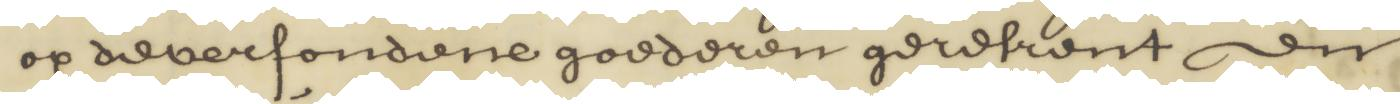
op de versondene goederen gerekent en
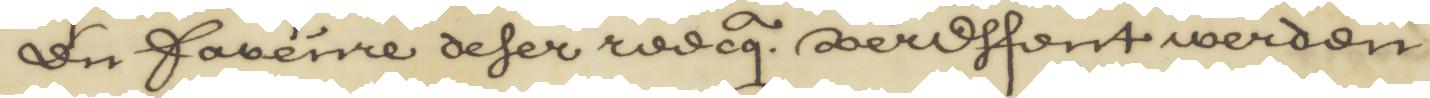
ten faveure deser reecq: verEffent werden
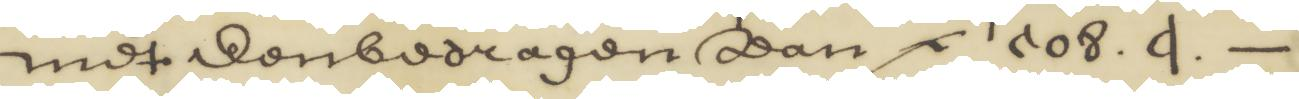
met Een bedragen van ƒ 508.4.-
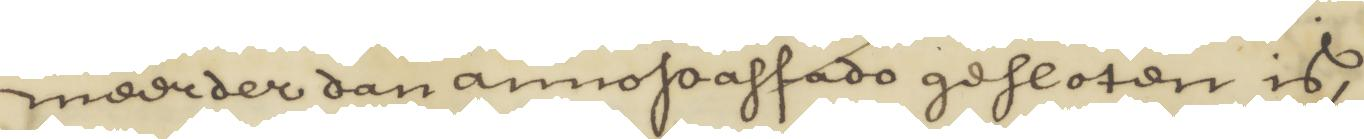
meerder dan anno passado gesloten is,
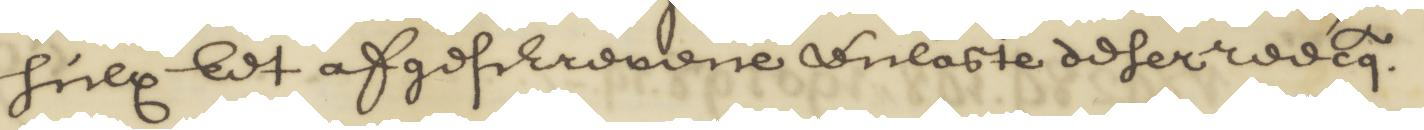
sulx het afgeschrevene tenlaste deser reecq.
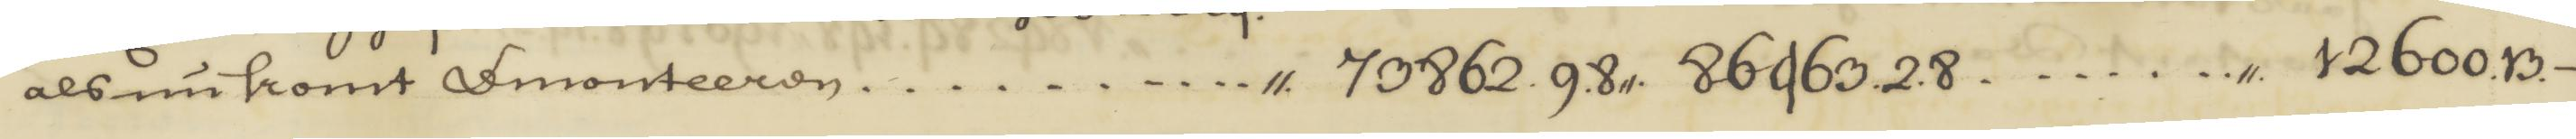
als nu komt te monteeren . . . . . . . . . . . „ 73862.9.8„ 86463.2.8. . . . . . . „ 12600.13.-
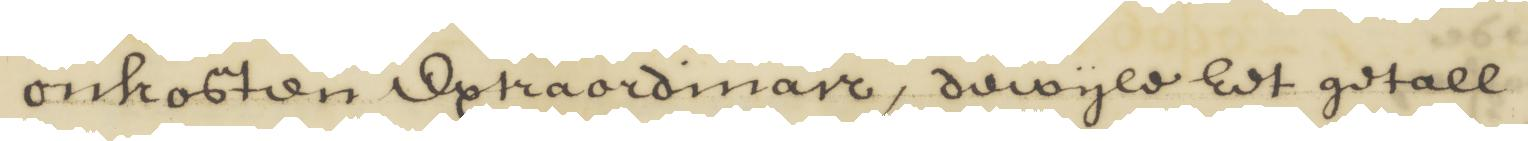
onkosten Extraordinair, dewijle het getall
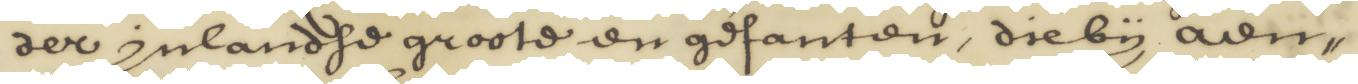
der inlandse groote en gesanten, die bij aen„
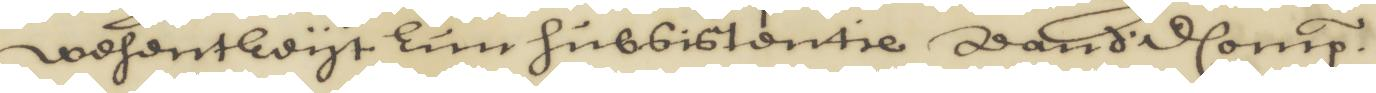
wesentheijt hun subsistentie van d' EComp.
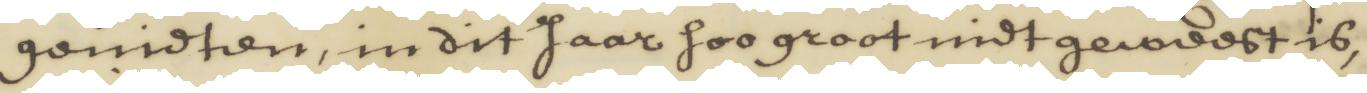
genieten, in dit Jaar soo groot niet geweest is,
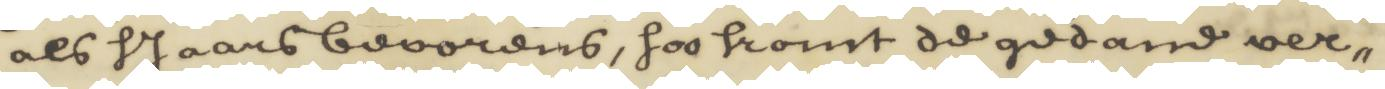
als 'sJaars bevorens, soo komt de gedane ver„
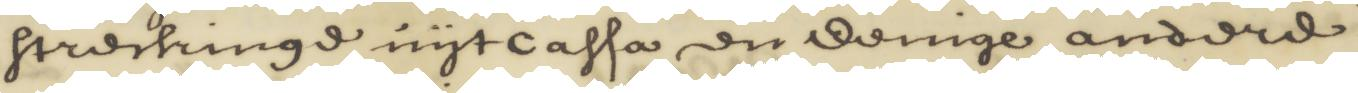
streckinge uijt cassa en Eenige andere
